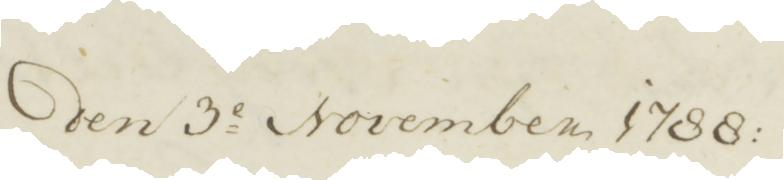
den 3=e November 1788:
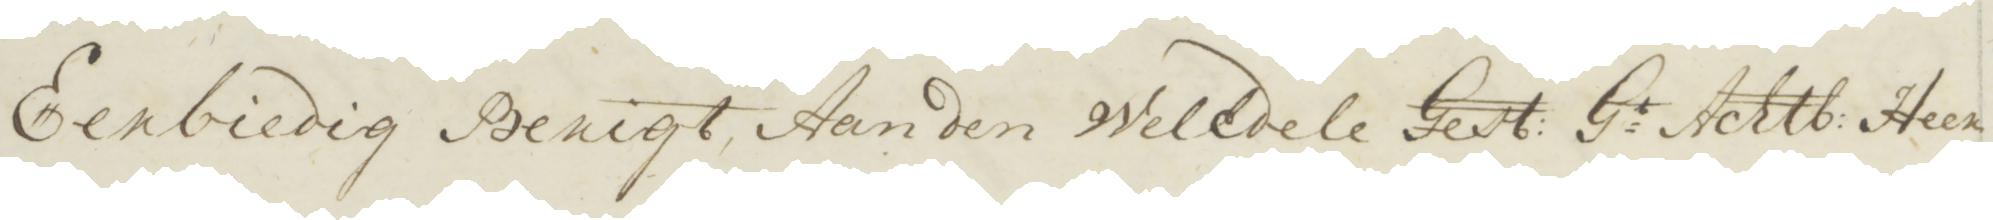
Eerbiedig Berigt, Aan den Wel Edele Gest: G:t Achtb: Heer
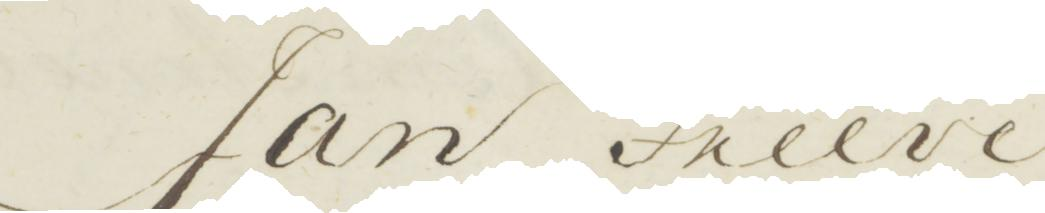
Jan Greeve
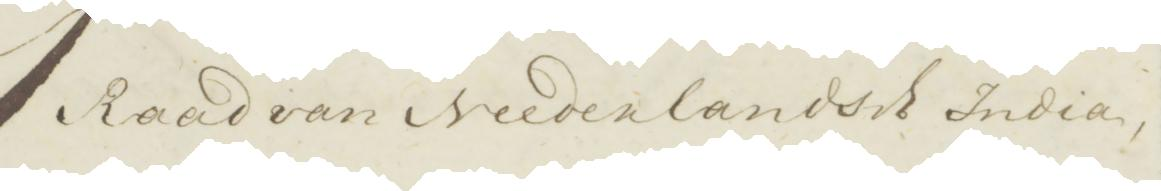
Raad van Neederlandsch India,
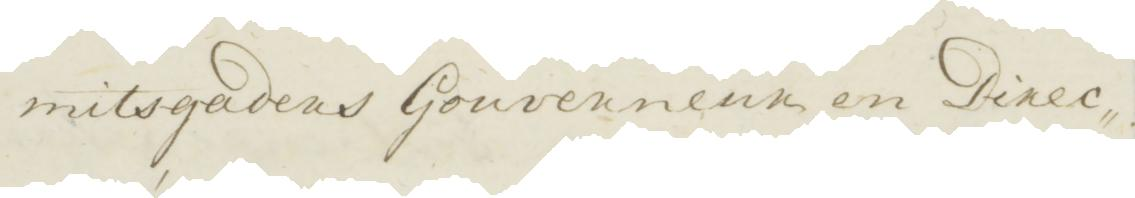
mitsgaders Gouverneur en Direc„
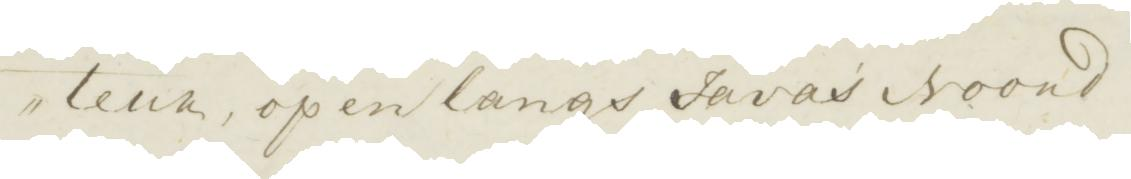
„teur, op en langs Iavas Noord
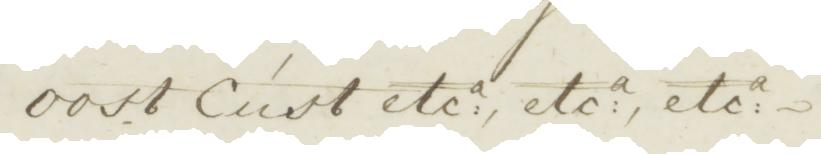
oost Cust etc:a, etc:a, etc:a ~
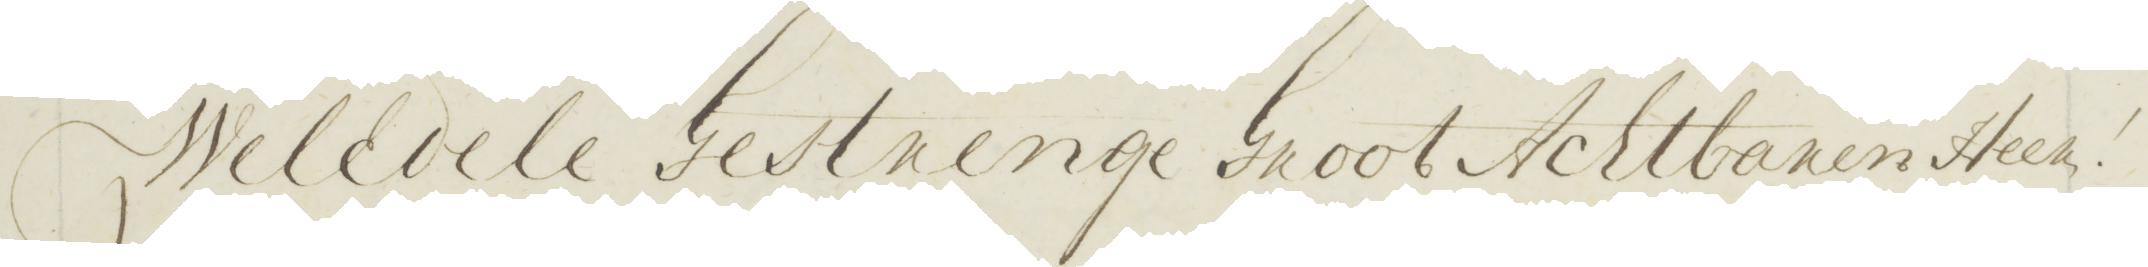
Wel Edele Gestrenge Groot Achtbaren Heer!
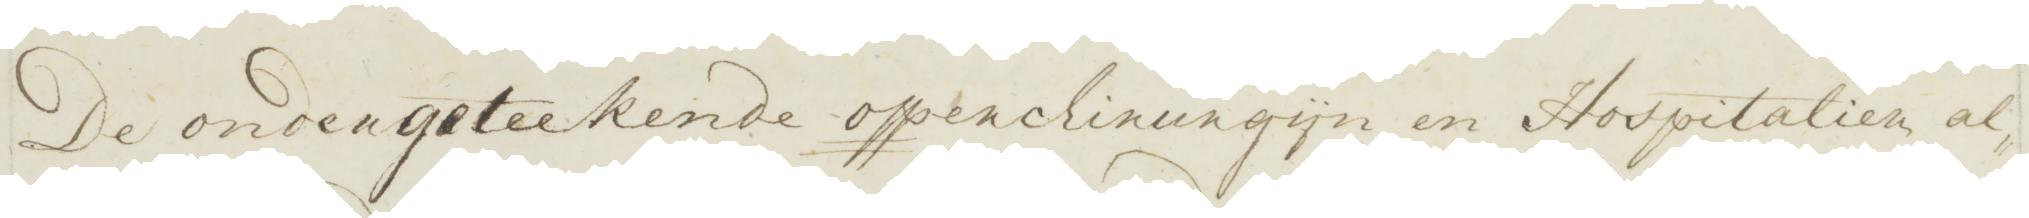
De ondergeteekende opperchirurgijn en Hospitalier al„
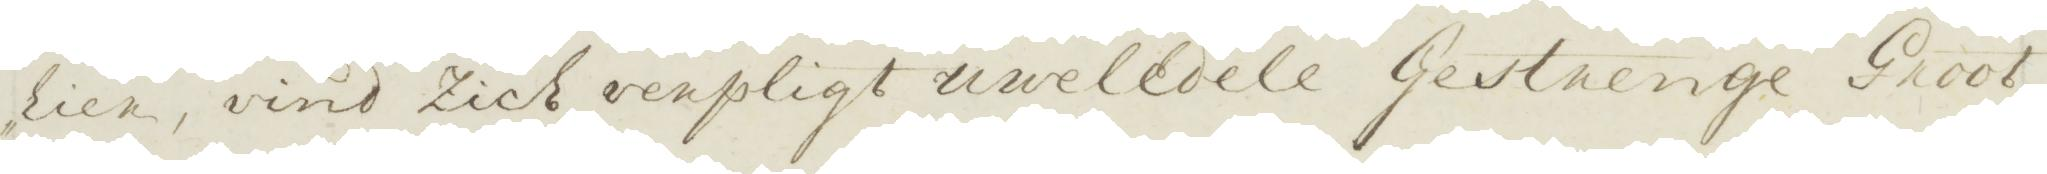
„hier, vind Zich verpligt uwel Edele Gestrenge Groot
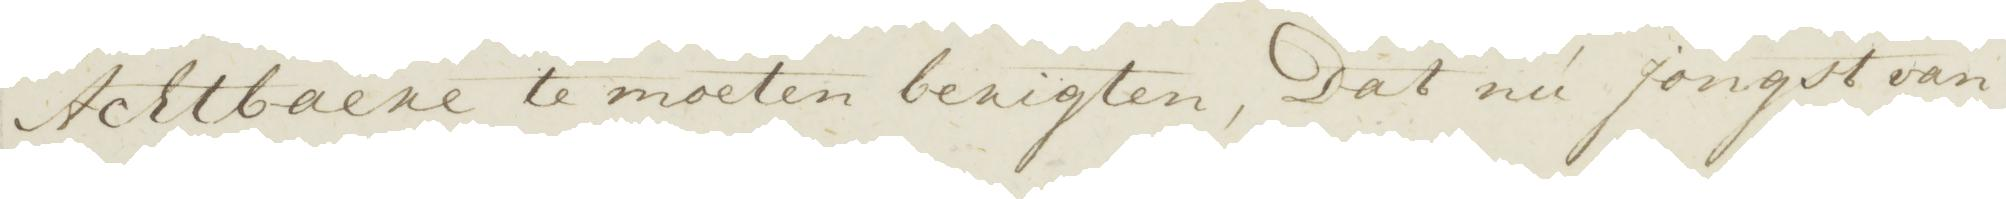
Achtbaere te moeten berigten, Dat nu Jongst van
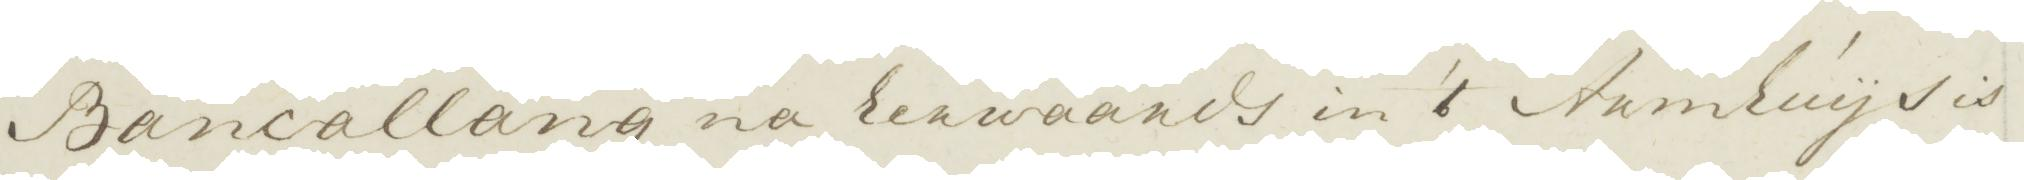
Bancallang na herwaards in ’t Armhuijs is
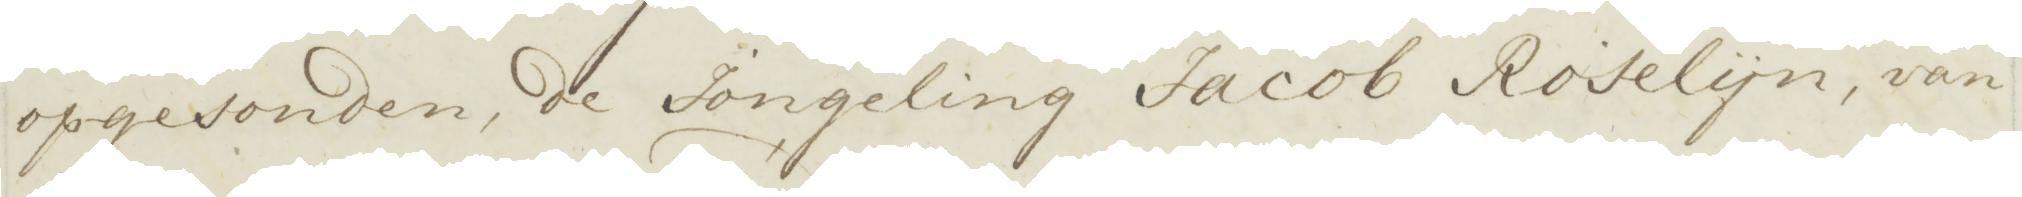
opgesonden, de Iongeling Jacob Roselijn, van
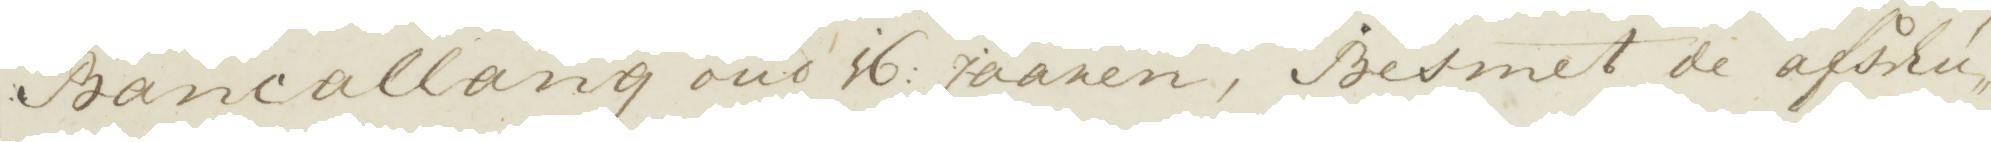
Bancallang oud 16: jaaren, Besmet de afschu„
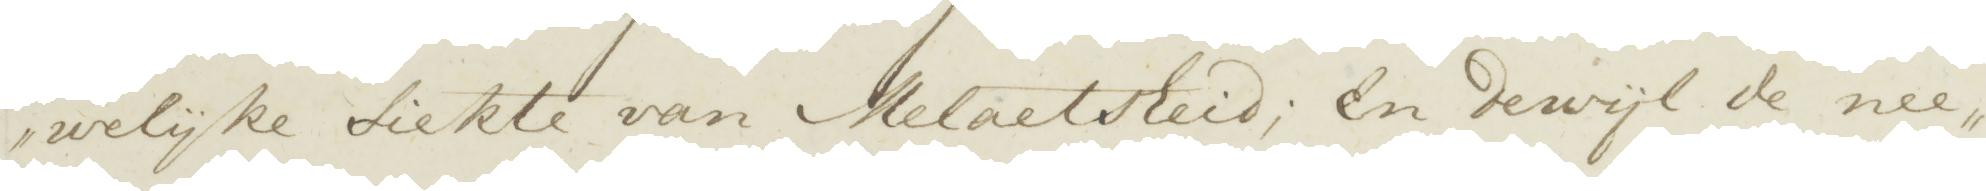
„welijke Siekte van Melaetsheid; En dewijl de nee„
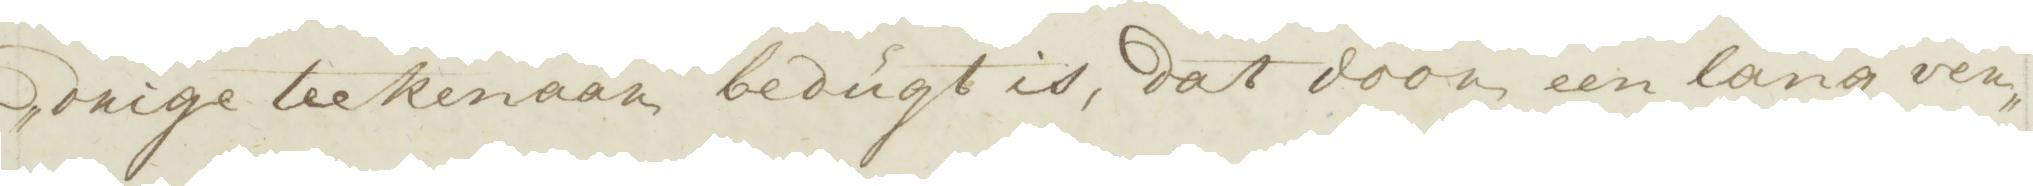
„drige teekenaar bedugt is, dat door een lang ver„
